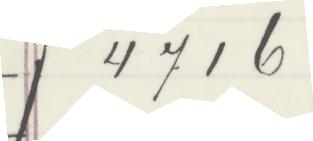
ƒ 4716
